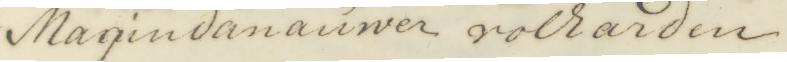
Magindanauwer volharden
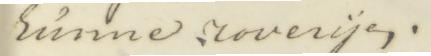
hunne roverijen.
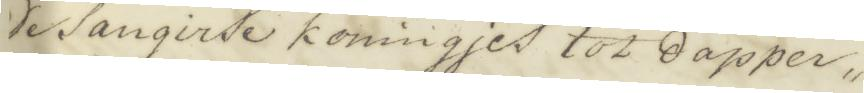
de sangirse koningjes tot dapper„
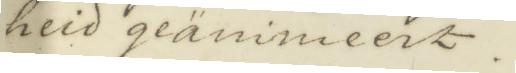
heid geänimeert.
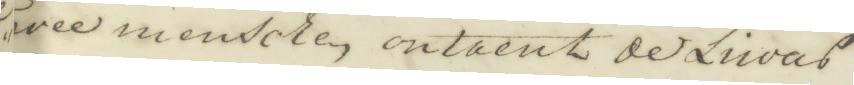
wee menschen ontrent de Liwas
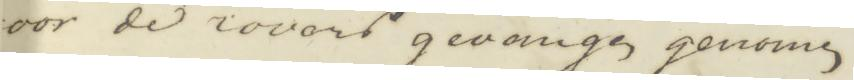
oor de rovers gevangen genomen
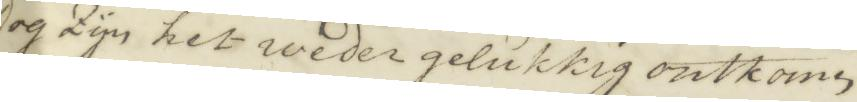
dog zijn het weder gelukkig ontkomen
